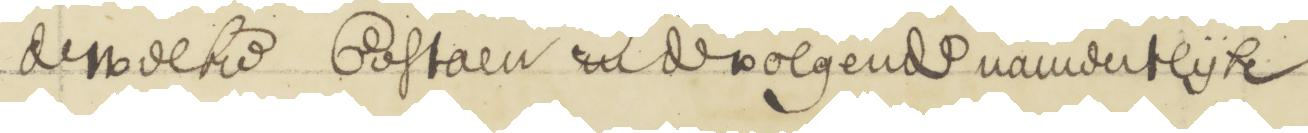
dewelke bestaen in devolgende namentlijk
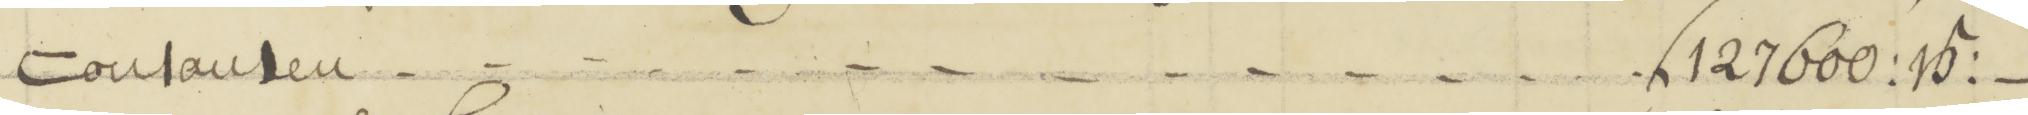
contanten - - - - - - - - - - - - - . . ƒ 127600: 15: —
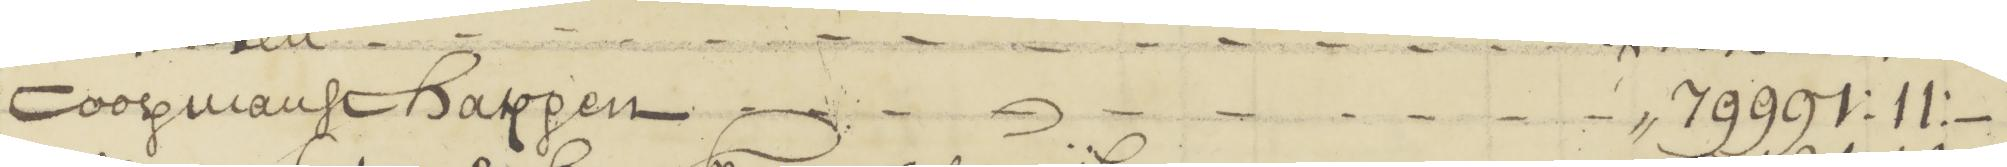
coopmanschappen - - - - - - - - - - „ 79991: 11: —
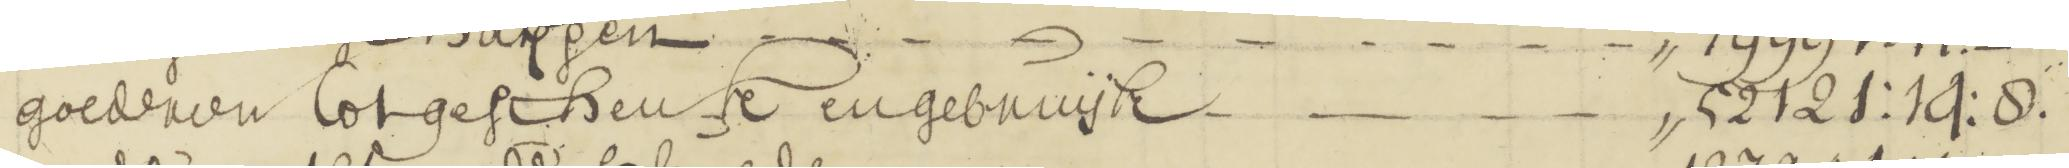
goederen totgeschenke engebruijk - - - - „ 52121: 14: 8.
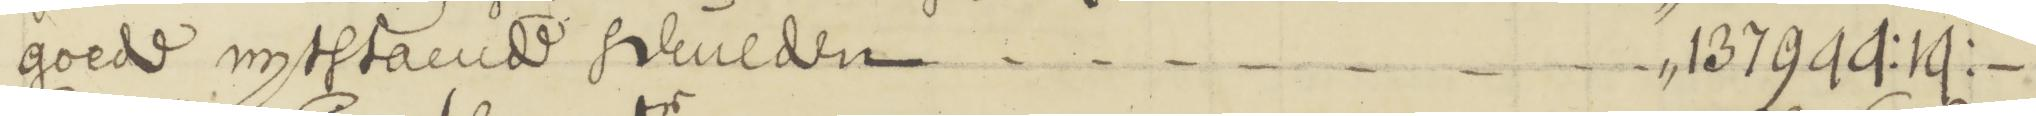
goede niytstaende schulden - - - - - - - - „ 137944: 14: —
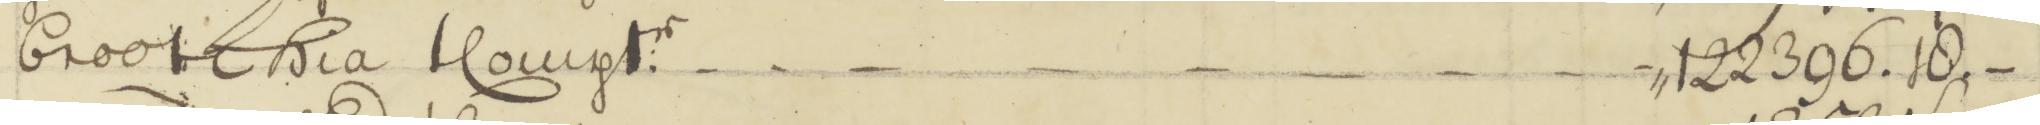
brootchia tCompt:r - - - - - - - - „ 122396. 18. —
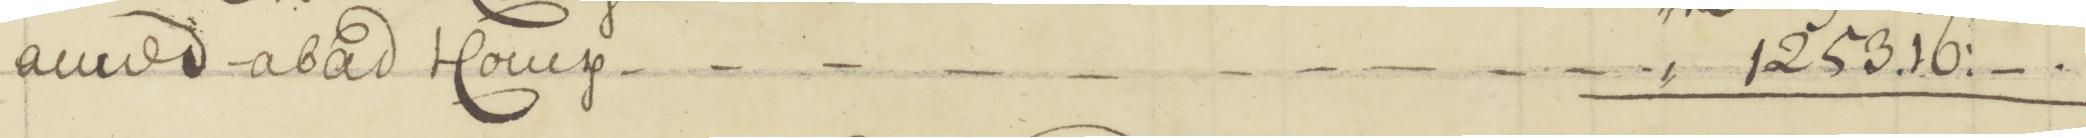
amed abad tComp - - - - - - - - - - - „ 1253. 16: —.
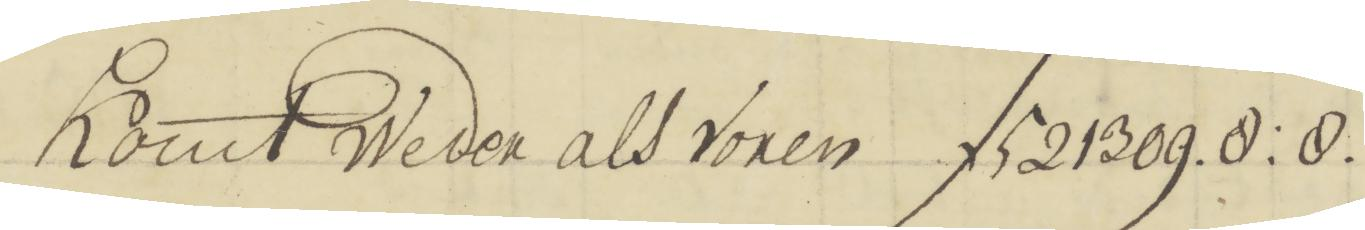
Komt Weder als Voren ƒ521309. 8: 8.
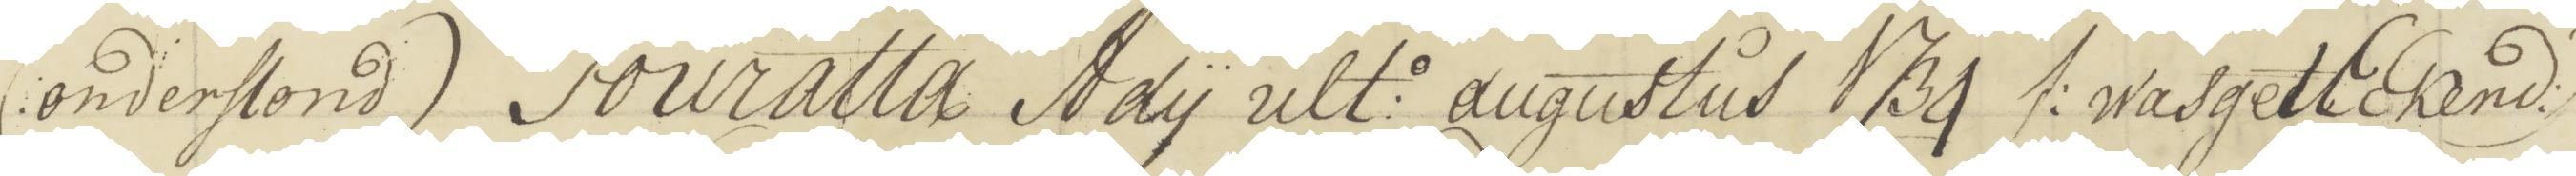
(:onderstond) Souratta Adij ult:o augustus 1734 /: was geteekend:)
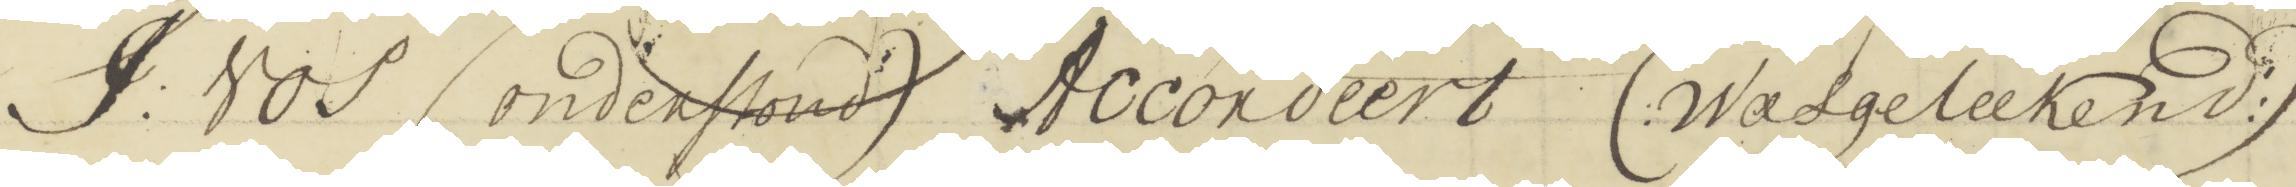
I: Vos (onderstond) Accordeert (:Wasgeteekend:)
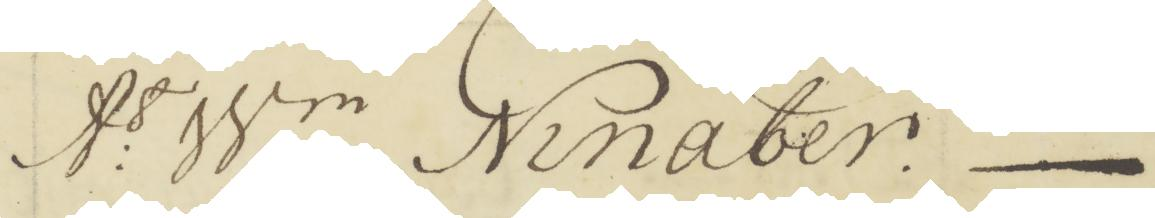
A:s W:m Ninaber. —
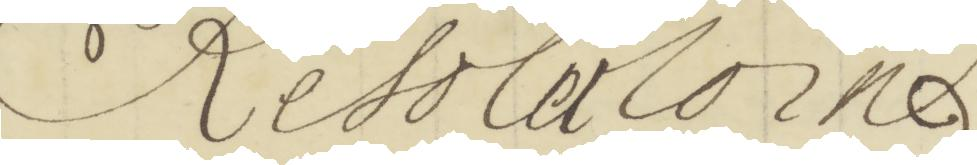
Resolutoir
